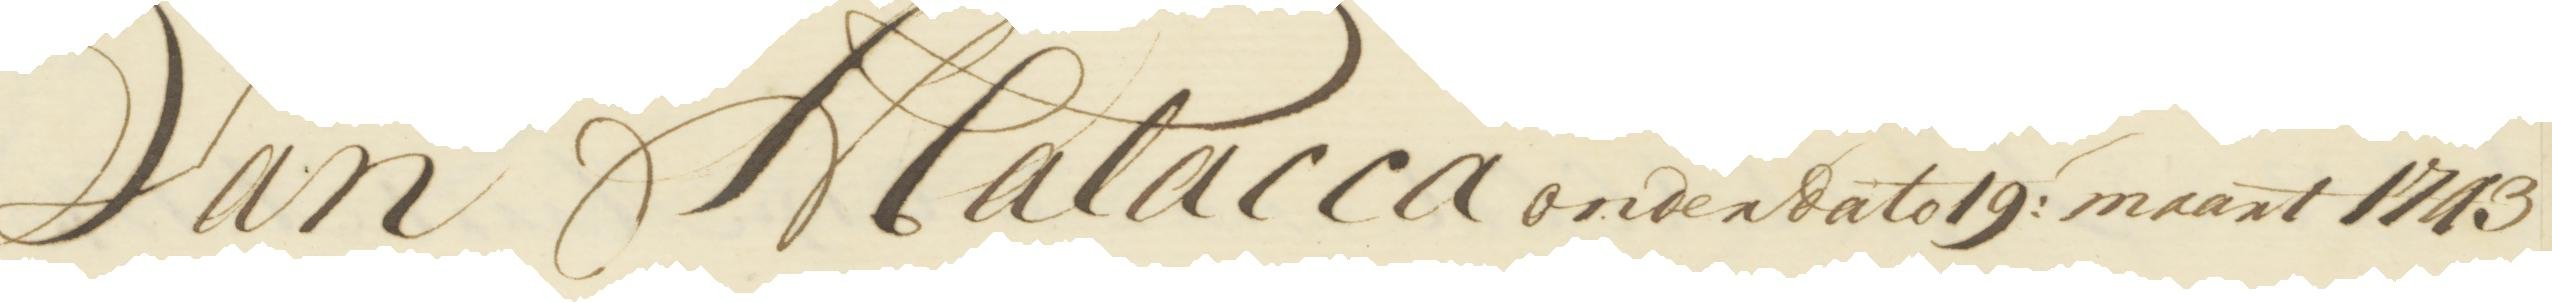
Van Malacca onder dato 19:' maart 1743
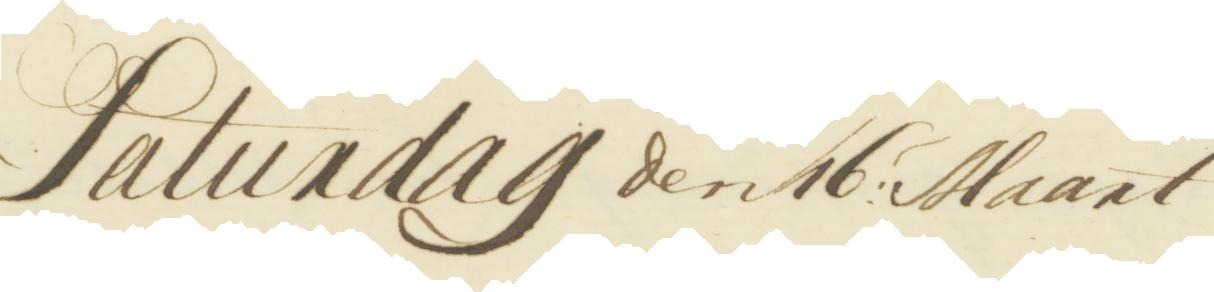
Saturdag den 16:' Maart
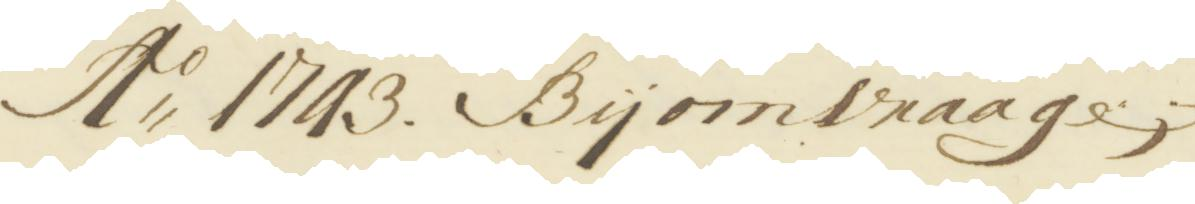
A„o 1743. Bij omvraage,
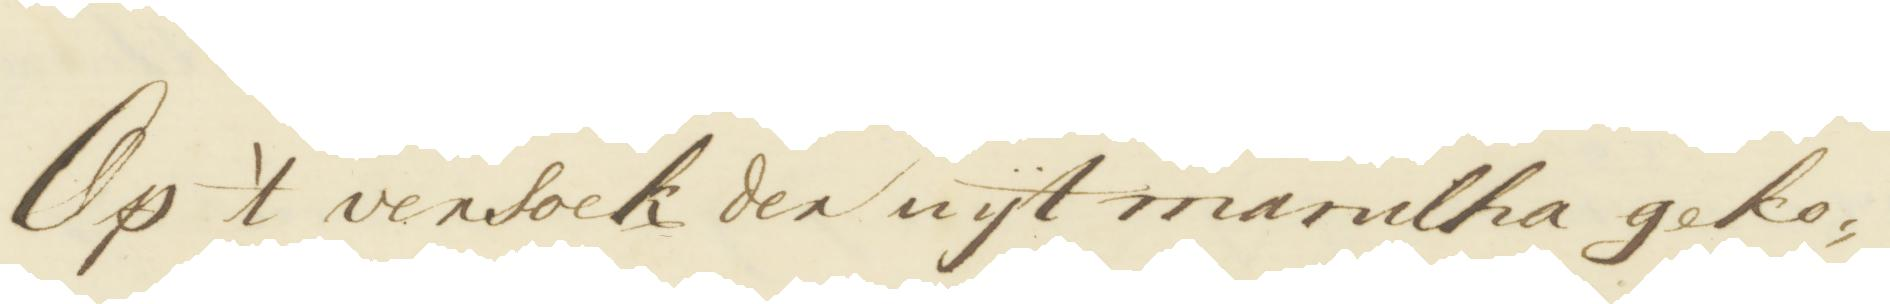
Op ’t versoek der uijt manilha geko„
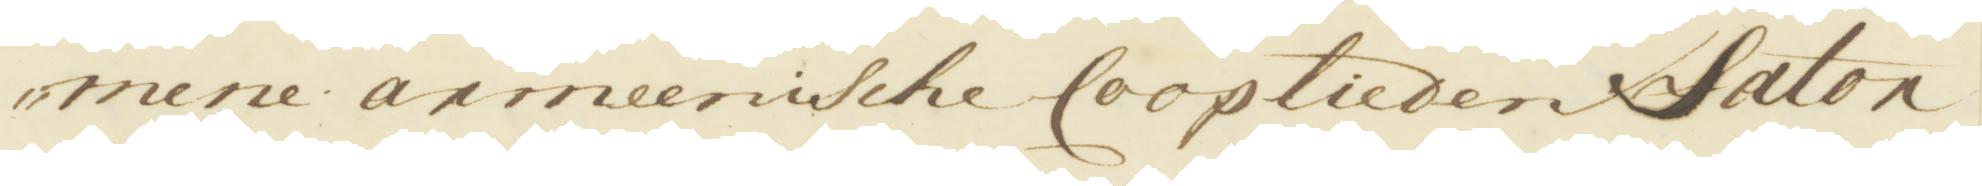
„mene armeenische Cooplieden Sator
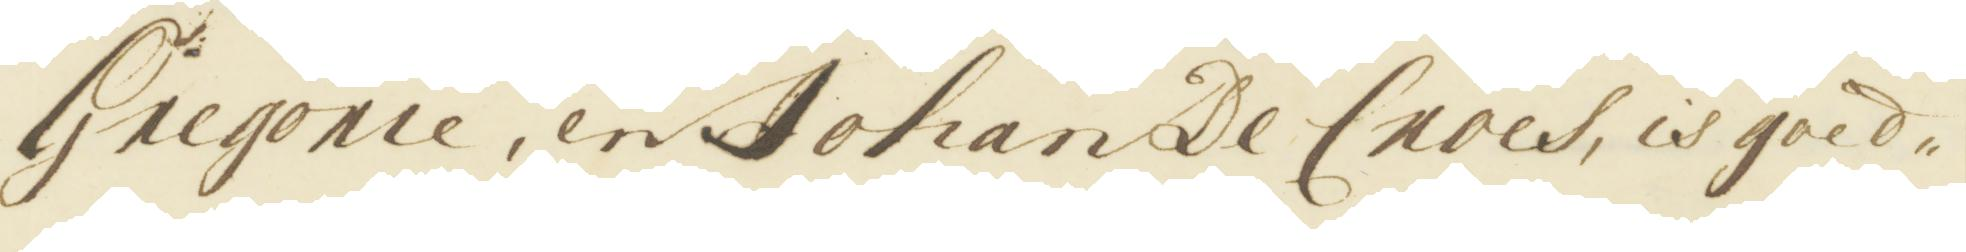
Gregorie, en Iohan De Croes, is goed„
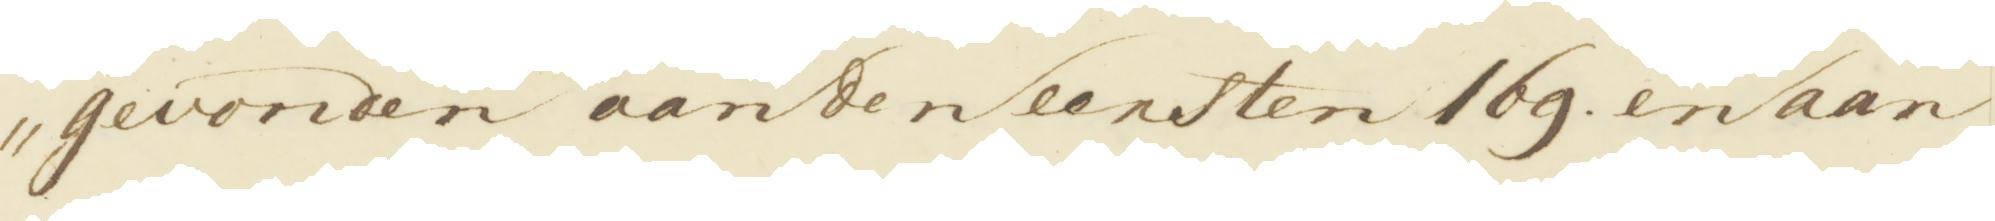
„gevonden aan den eersten 169. en aan
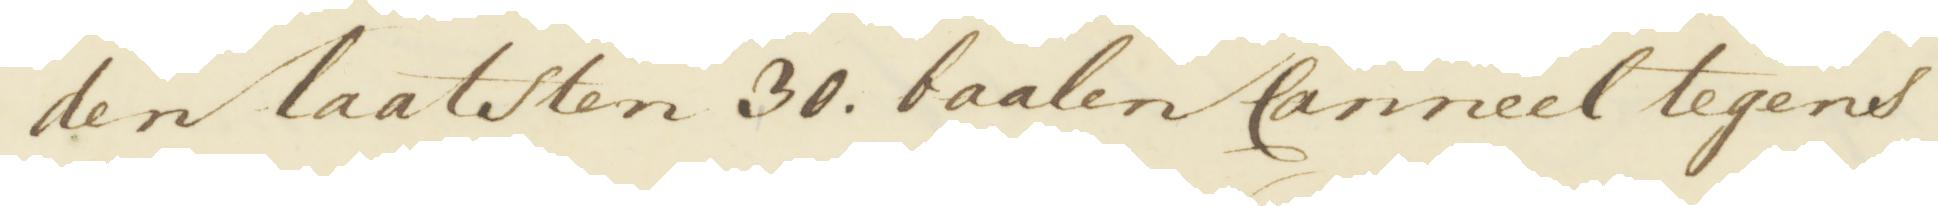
den laatsten 30. baalen Canneel tegens
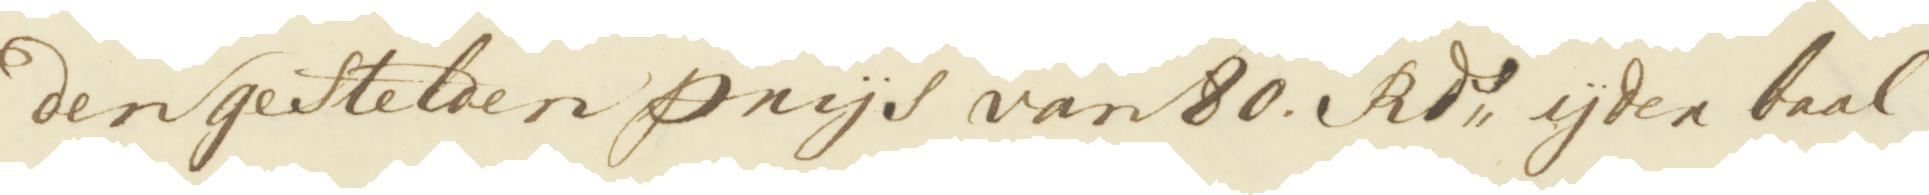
den gestelden prijs van 80. Rd„s ijder baal
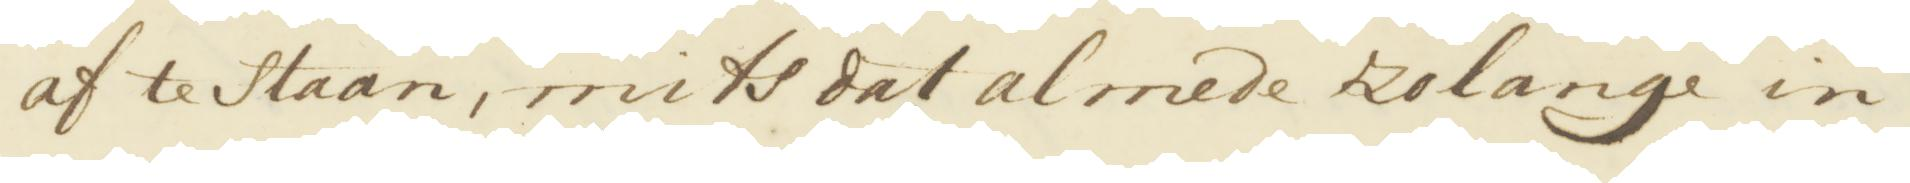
af te staan, mits dat almede zolange in
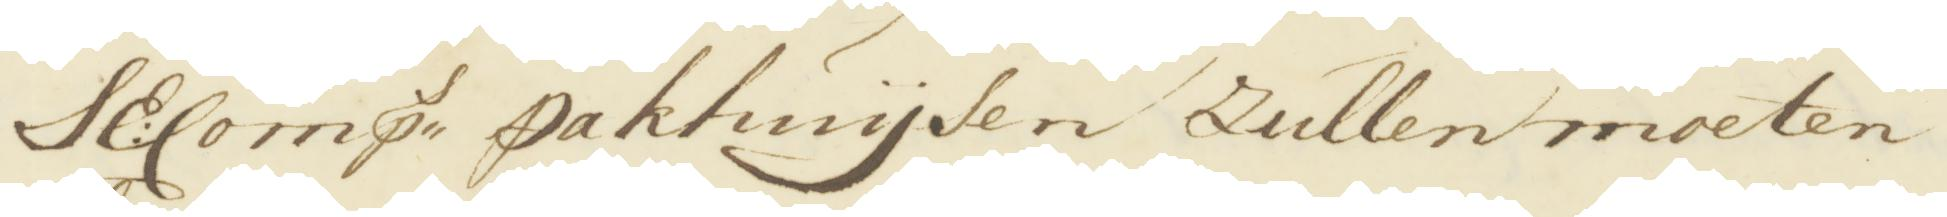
S E:Comp„s pakhuijsen Zullen moeten
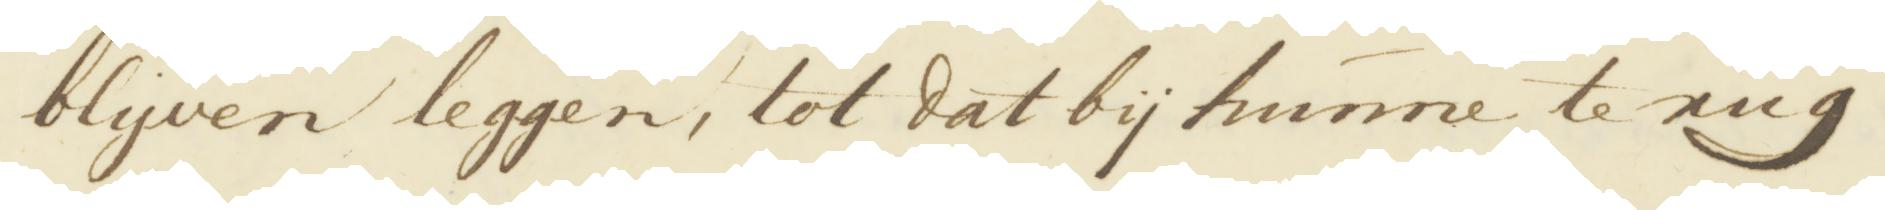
blijven leggen, tot dat bij hunne te rug
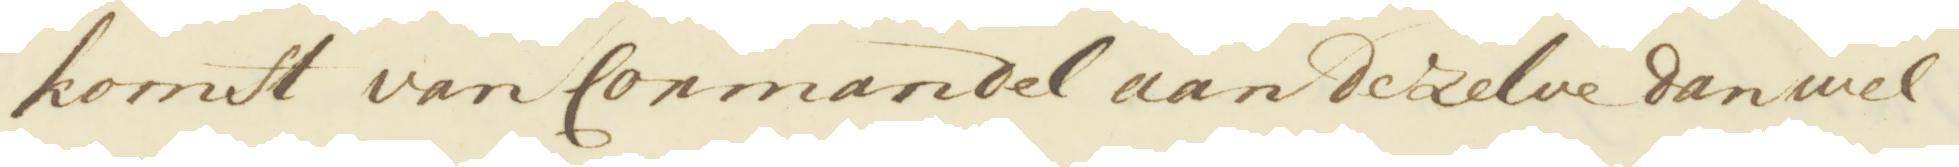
komst van Cormandel aan dezelve dan wel
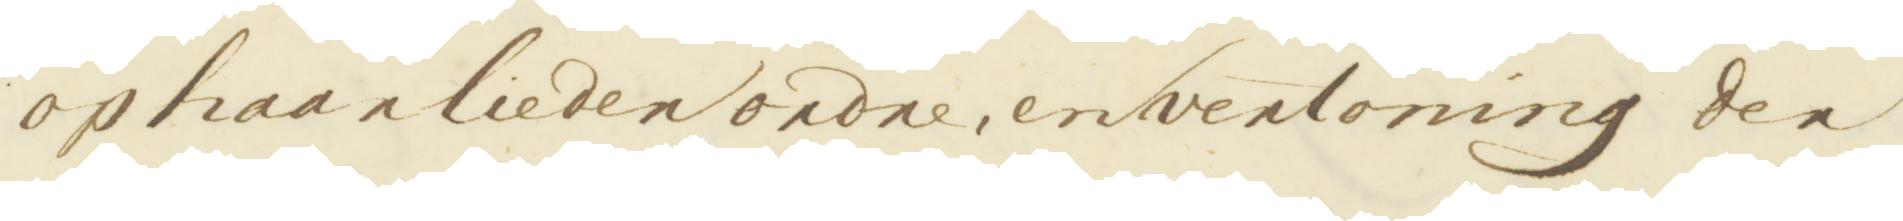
op haarlieden ordre, en vertoning der
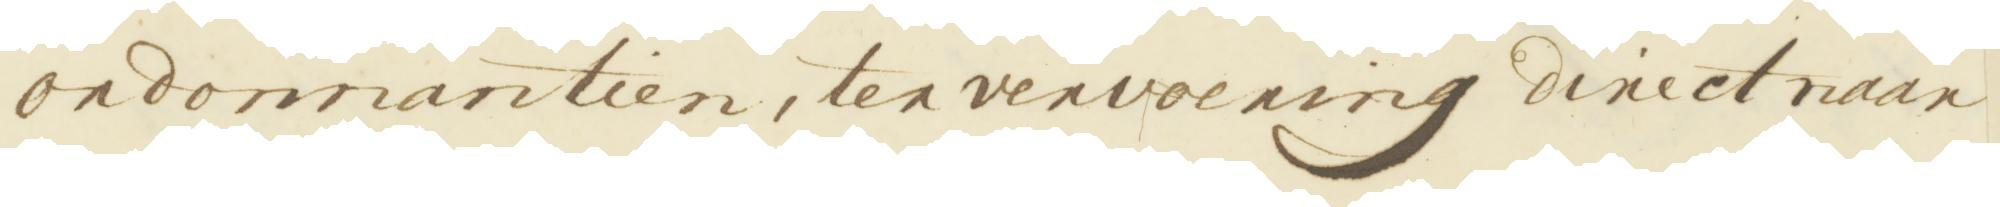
ordonnantien, ter vervoering direct naar
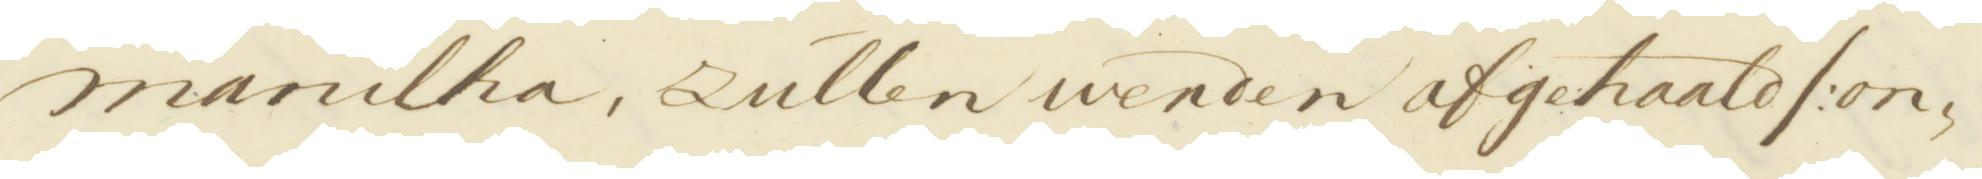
manilha, zullen werden afgehaald /:on„
